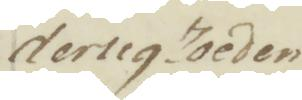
dertig roeden
